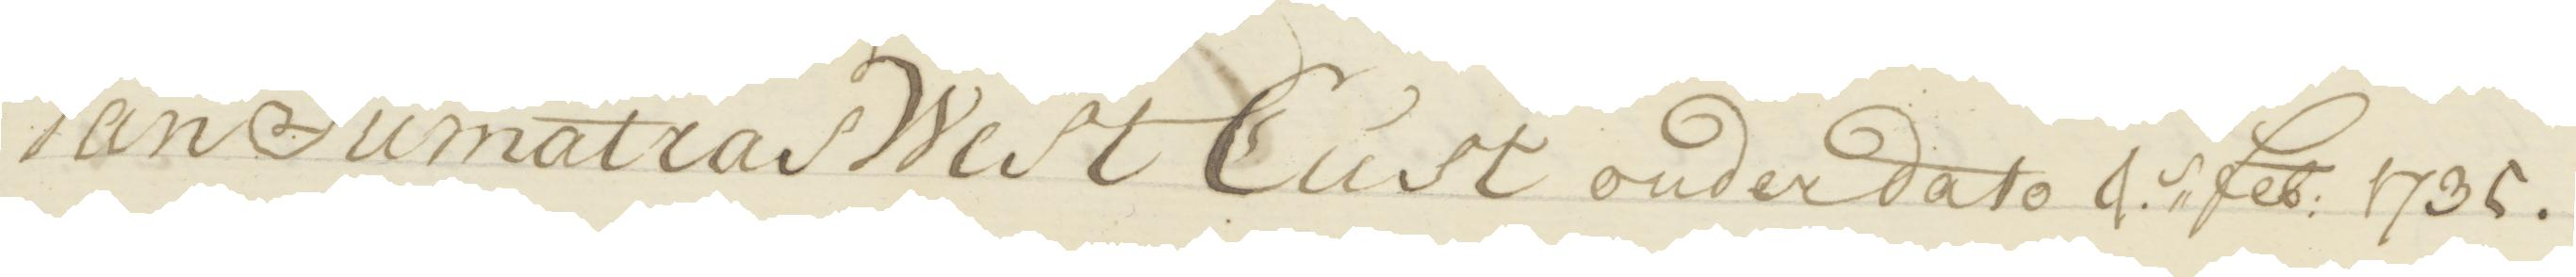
an Sumatras West Cust onder dato 4.'„ feb: 1735.
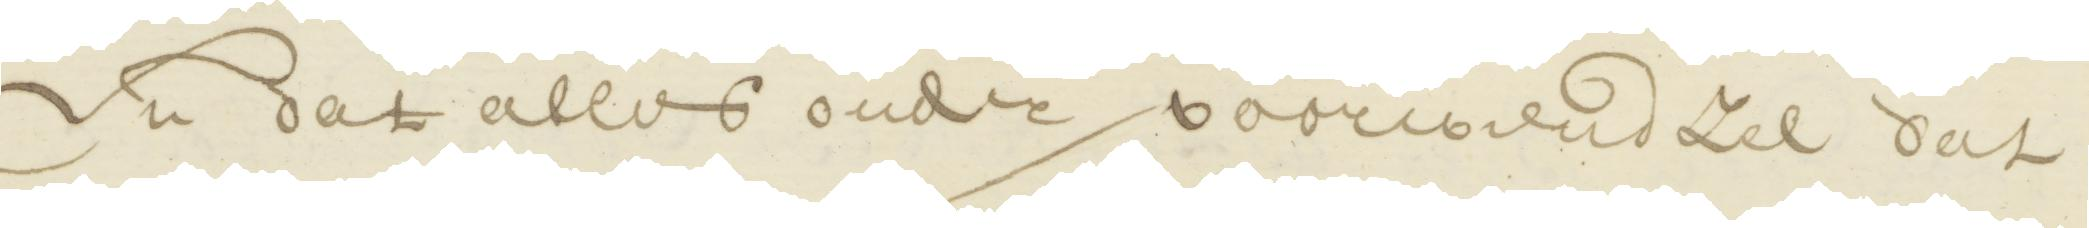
En dat alles onder voorwendzel dat
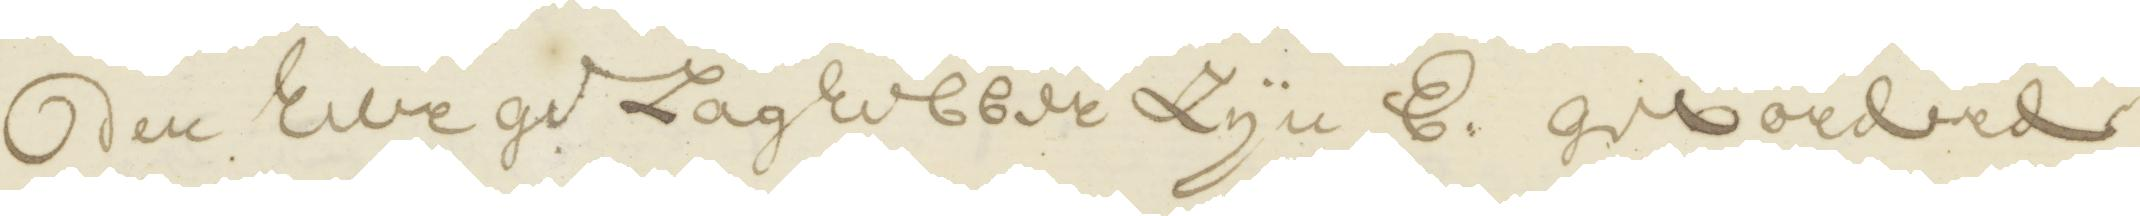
der here gezaghebber Zijn E. gevorderde
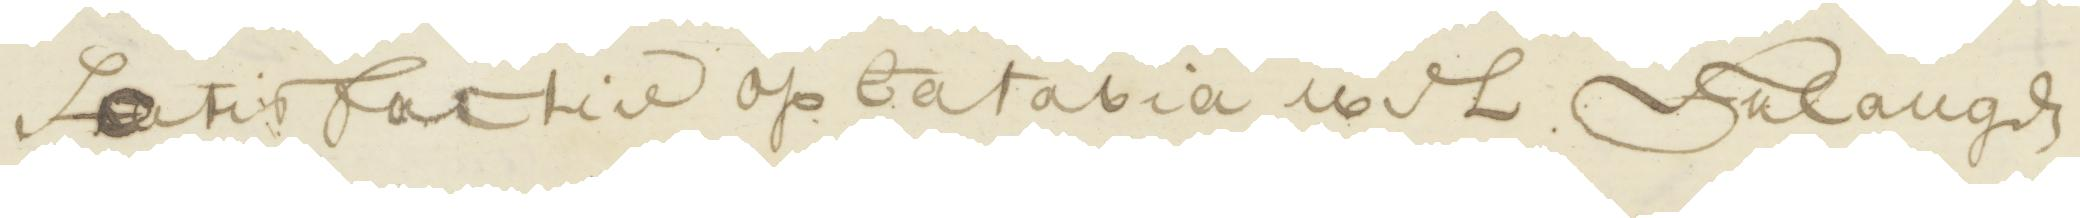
Satisfactie op batavia wel Erlangen
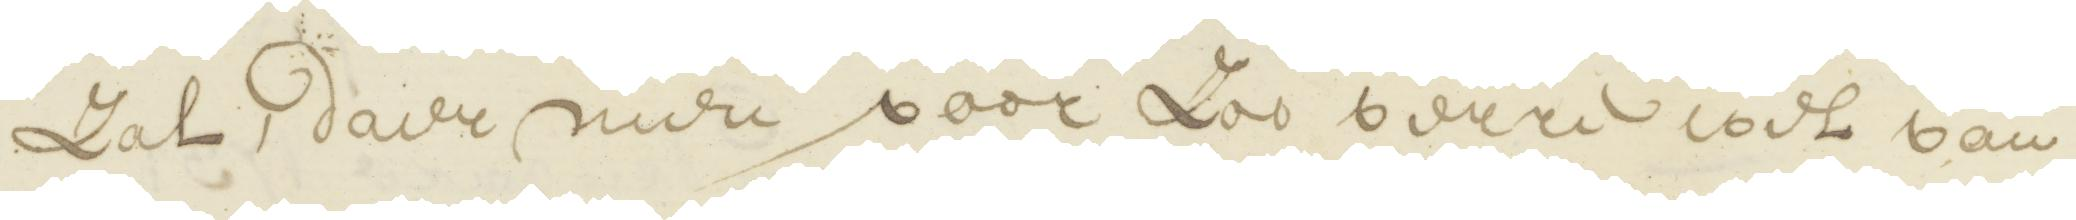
Zal, daer men voor Zoo verre wel van
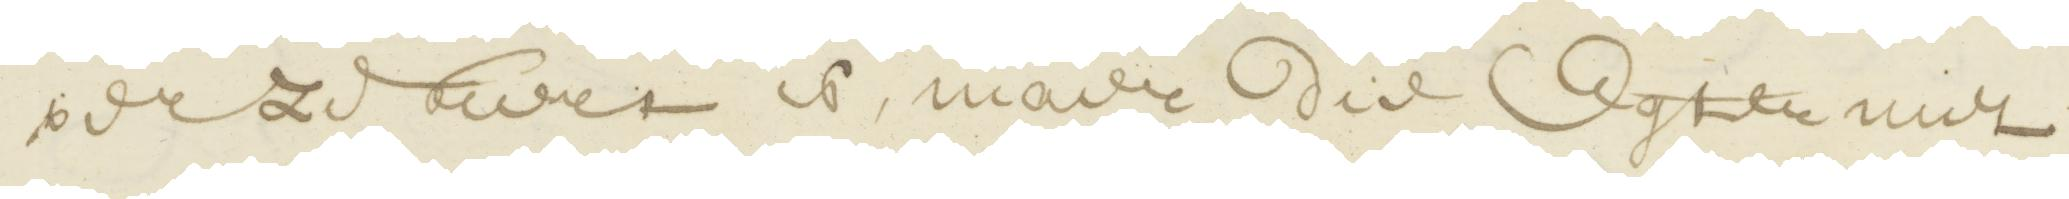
verzekert is, maer die Egter niet
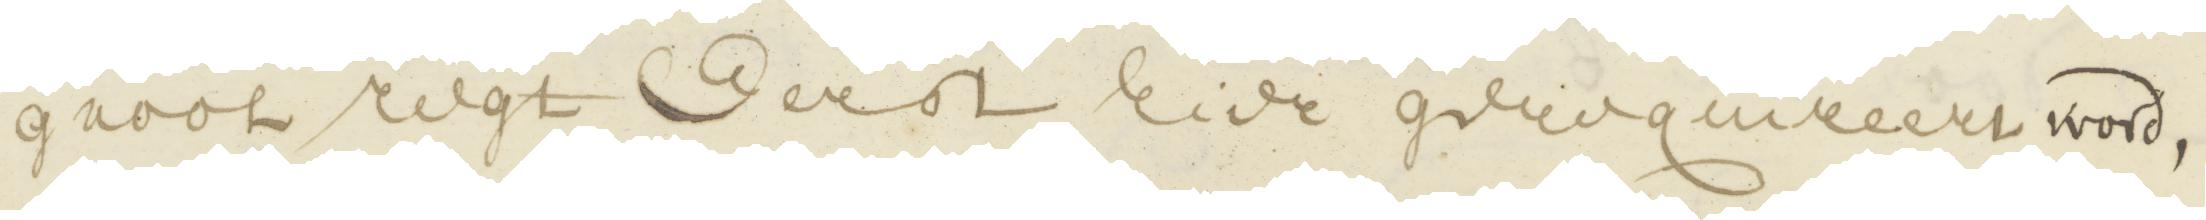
groot regt Eerst hiergerequireert word,
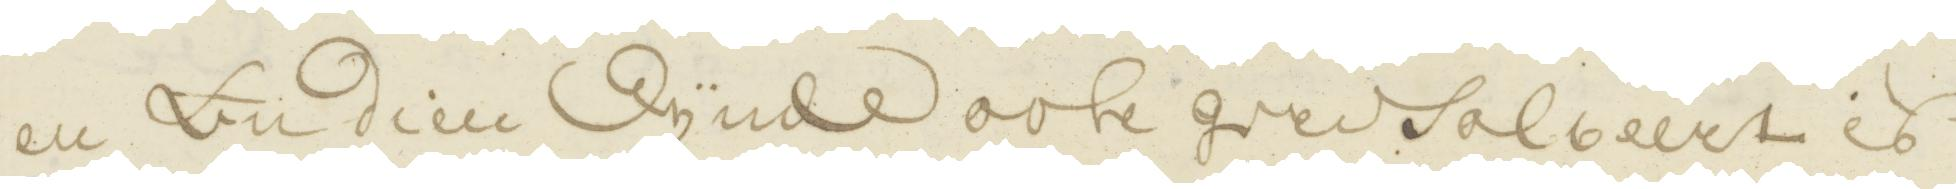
en ten dien Eijnde ook geresolveert is
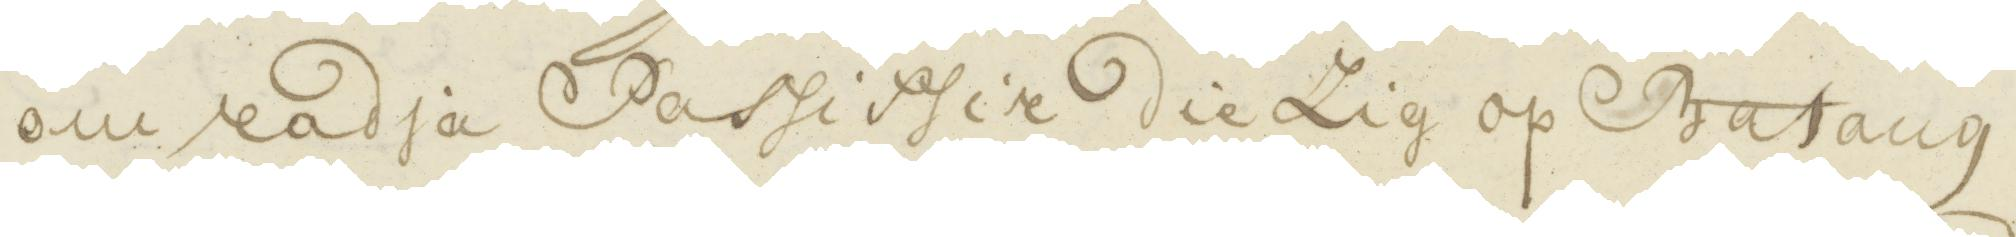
om radja Passissir die Zig op Batang
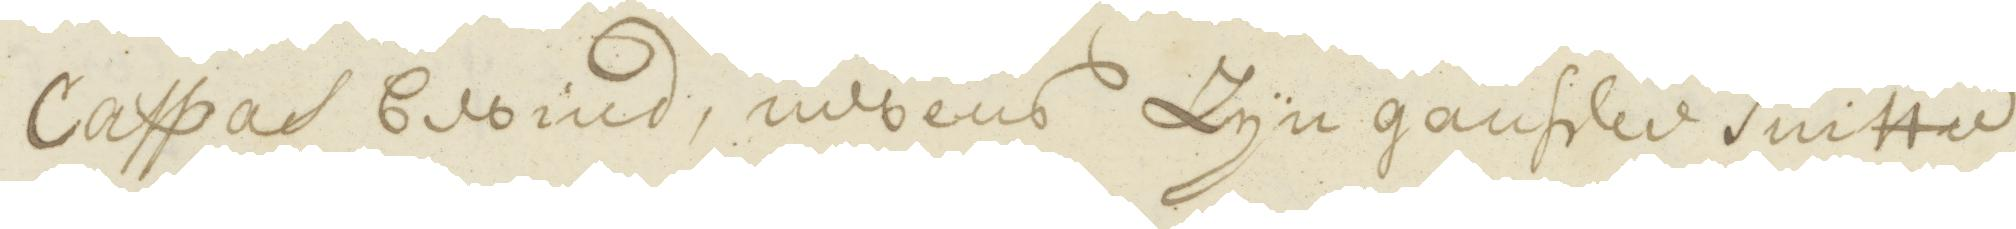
Cappas bevind, nevens Zijn gansche Suitte
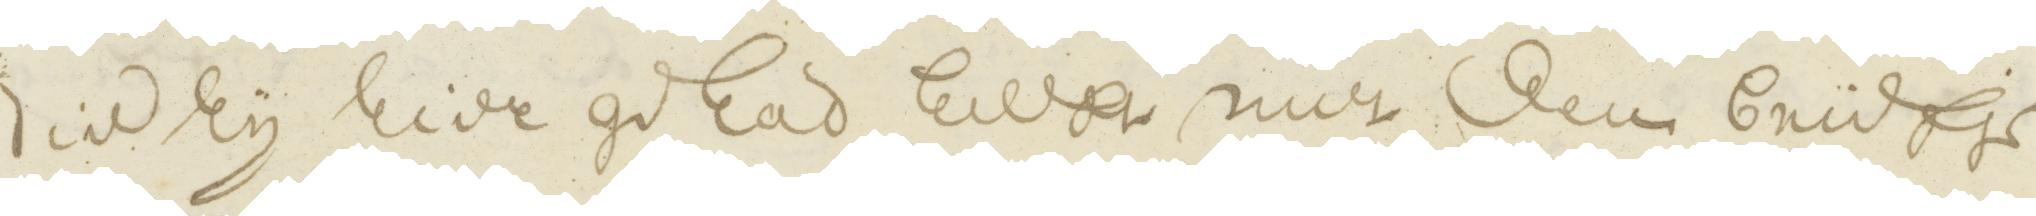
die hij hier gehad heeft met Een briefje
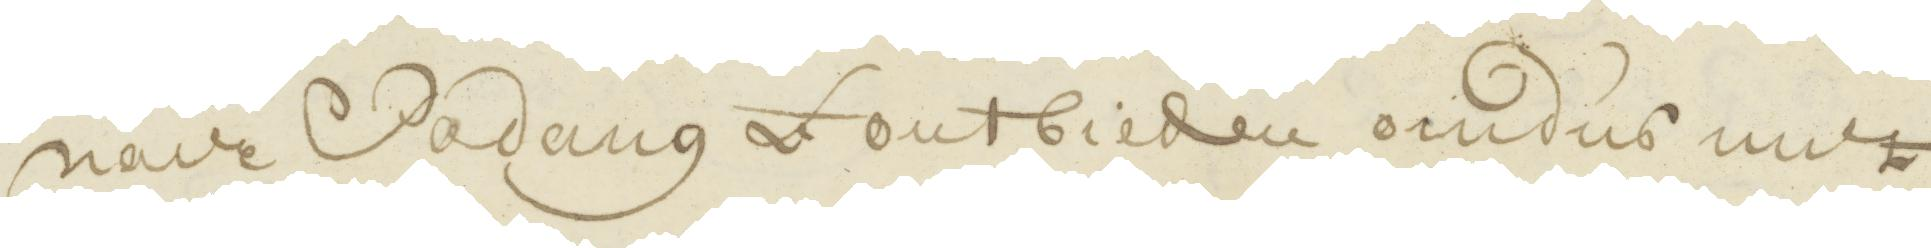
naer Padang te ontbieden omdus met
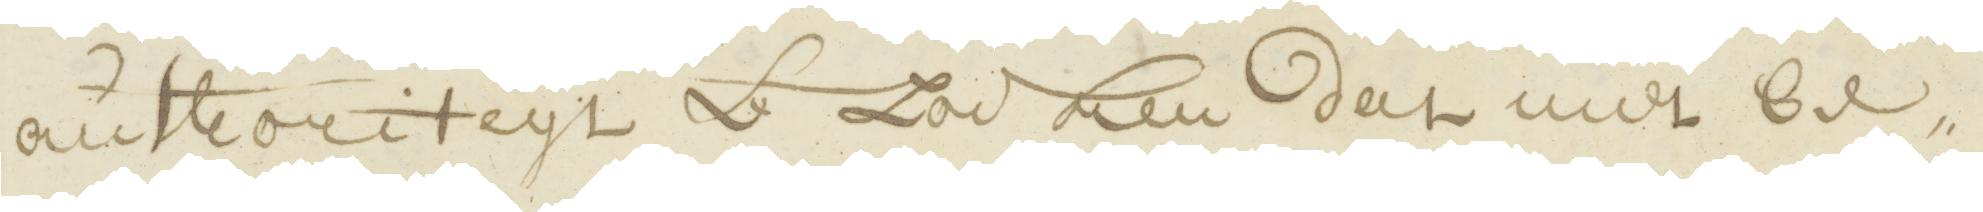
anthoriteijt te zoeken dat met be„
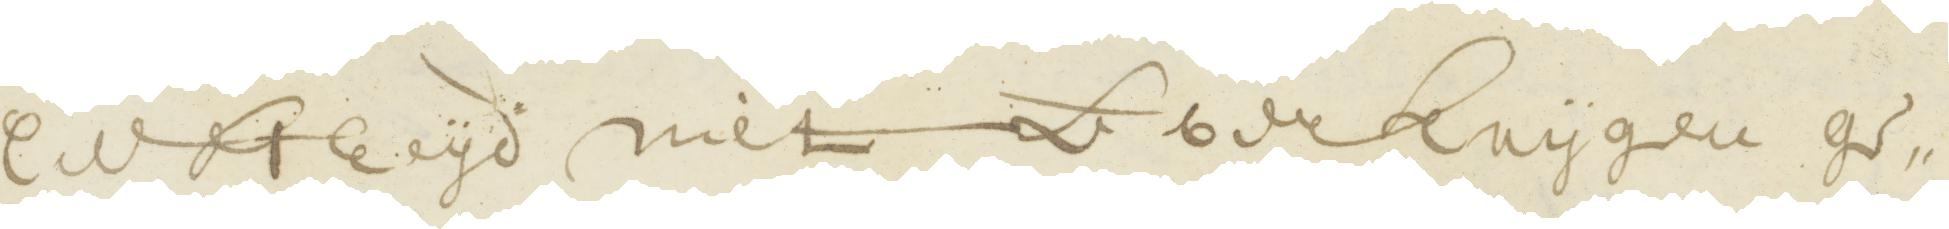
leeftheijd niet te verkrijgen ge„
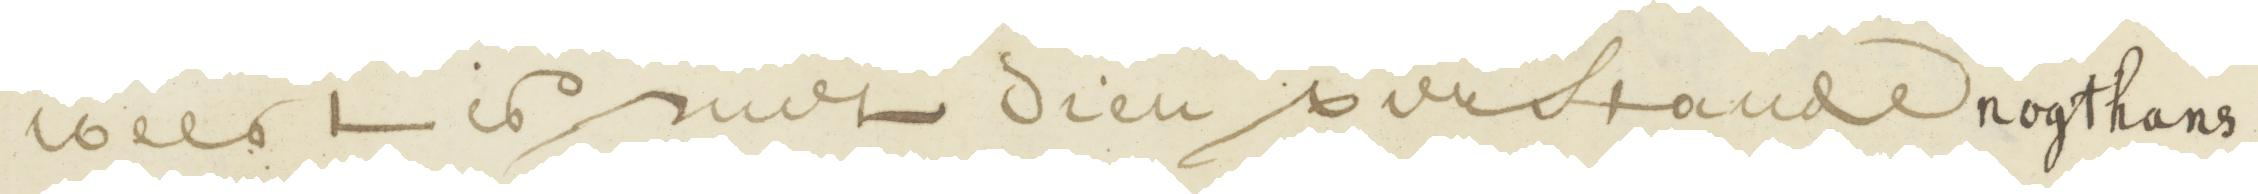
weest is met dien verstande nogthans
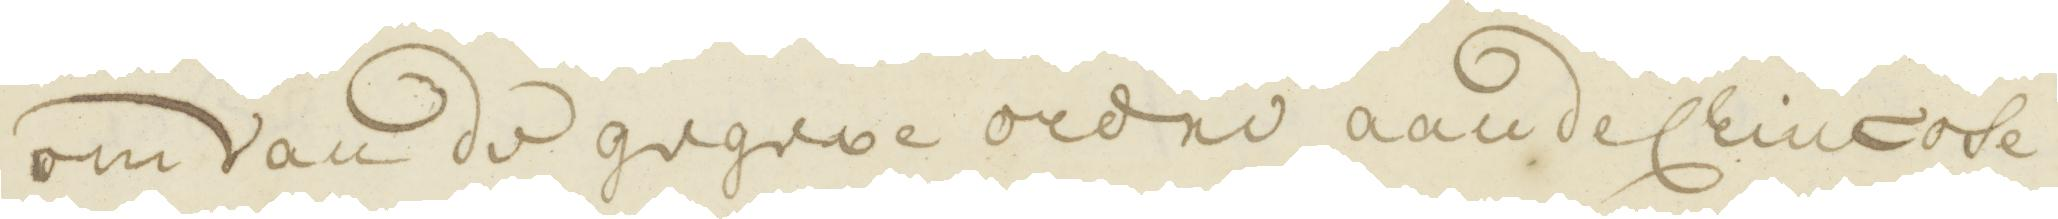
om van de gegeve ordre aan de Chincose
